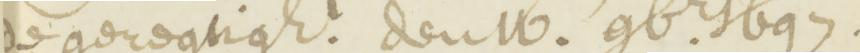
de geregtigh:t den 16.' gb:r 1697.
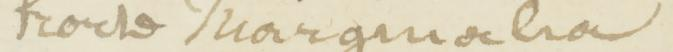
korte Marginalia
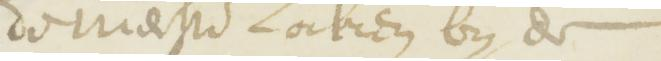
de meste Zaken bij de
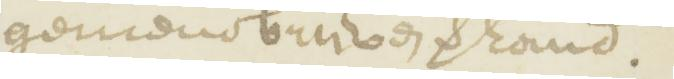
gemene brieven verhand.t
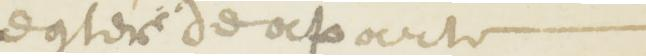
egter de aparte
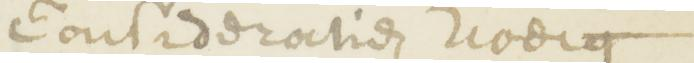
Consideratien nodig
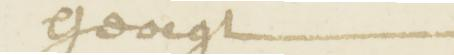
geagt
